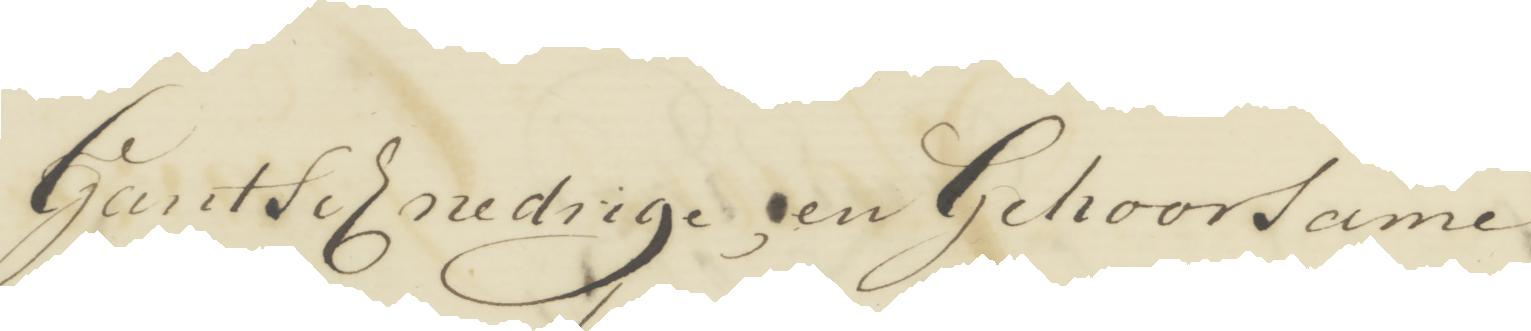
Gantsch nedrige, en Gehoorsame
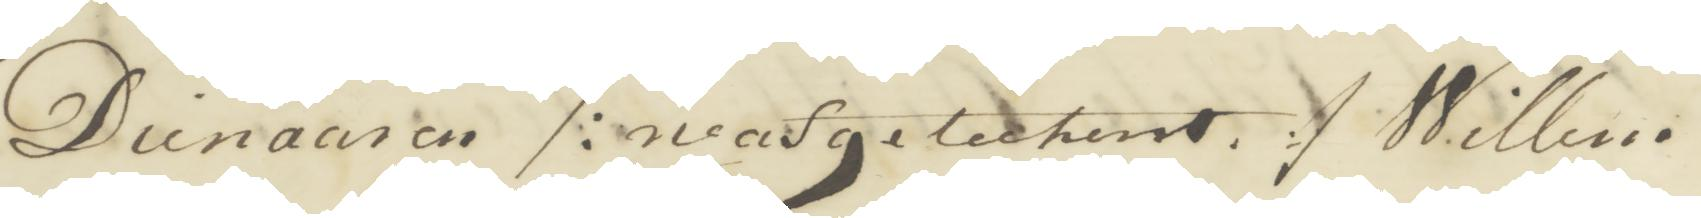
Dienaaren /:was geteekent.:/ Willem
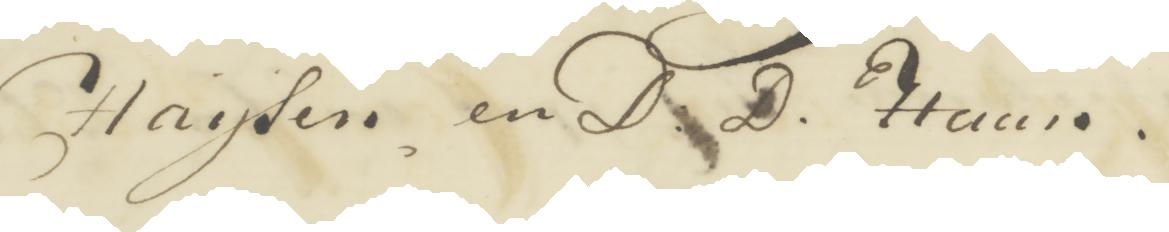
Haijsen, en D: D: Haan.
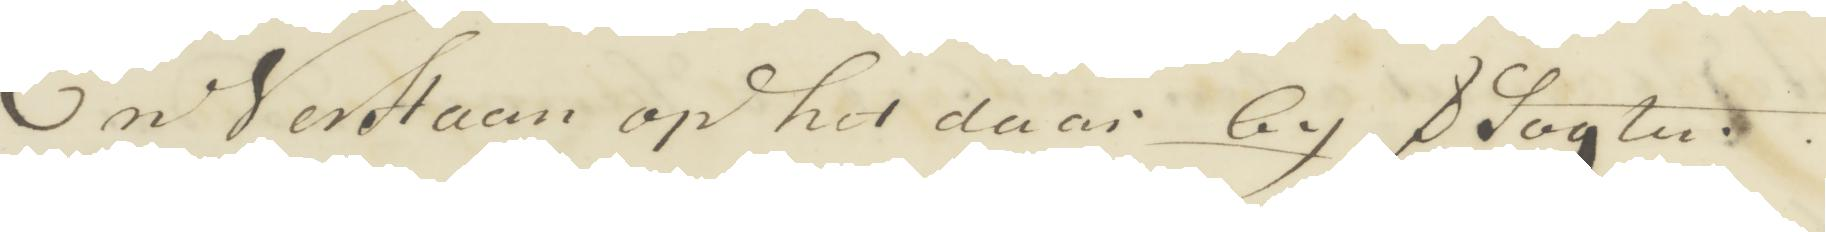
En Verstaan op het daar bij versogten.
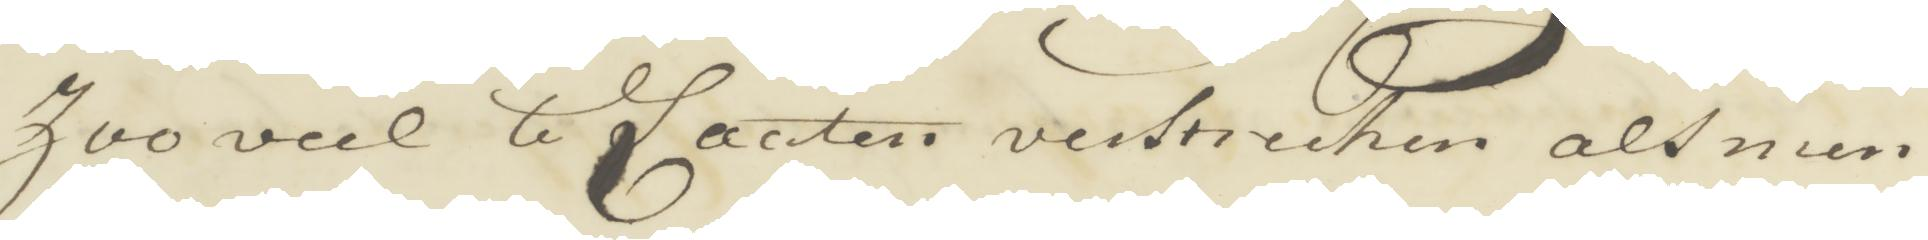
zoo veel te laeten verstrecken als men
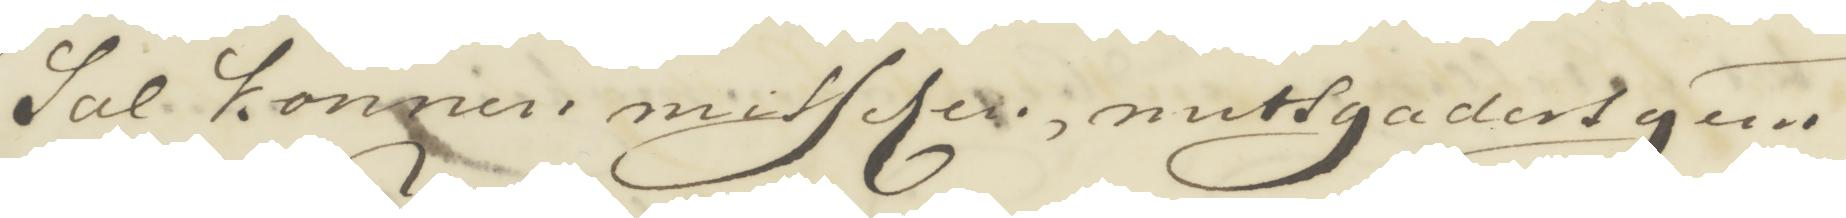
sal konnen misschen, mitsgaders gem
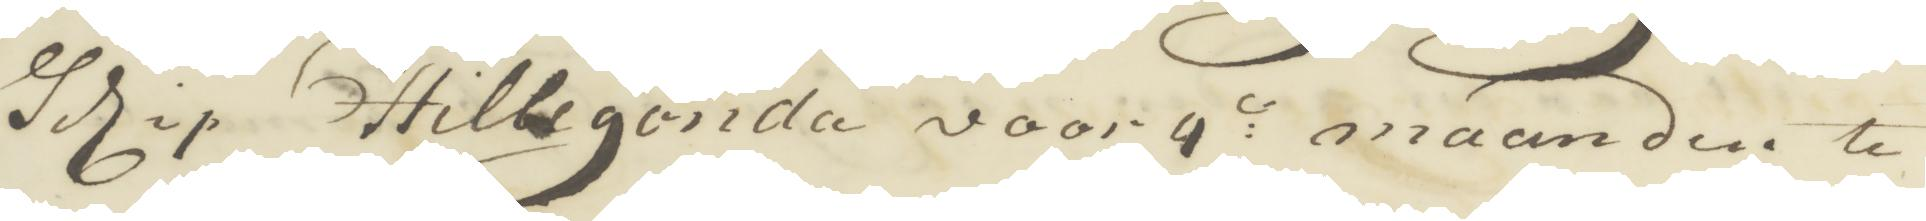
schip Hillegonda voor 4:' maanden te
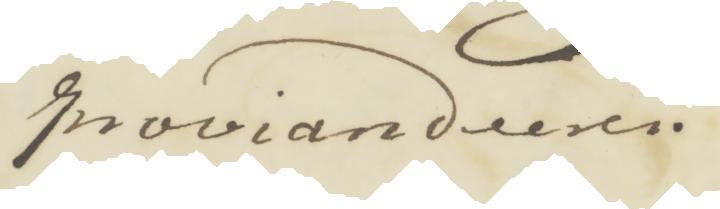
proviandeeren
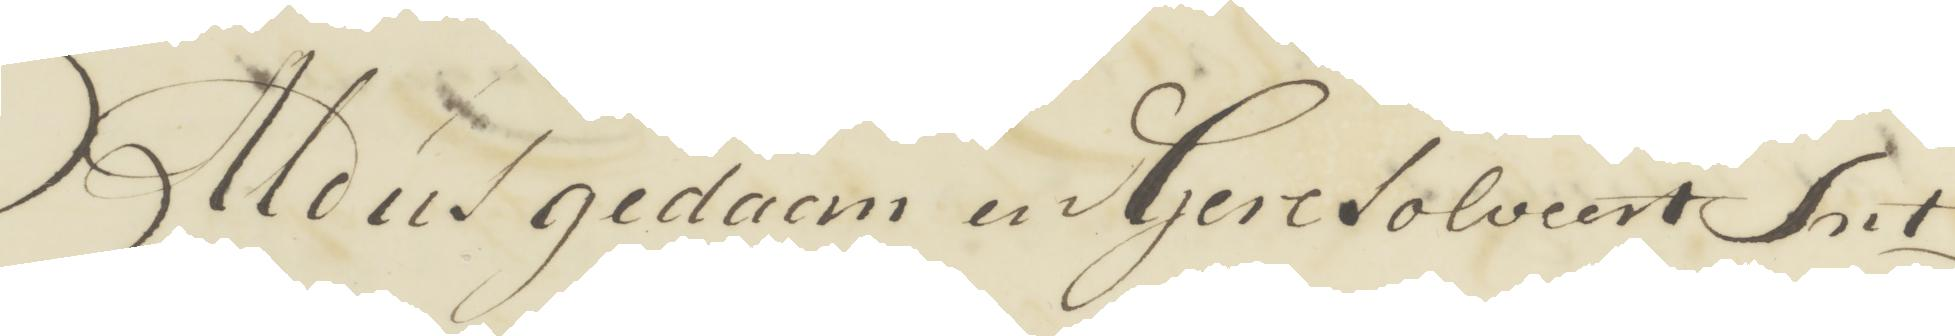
Aldus gedaan en Geresolveert Int
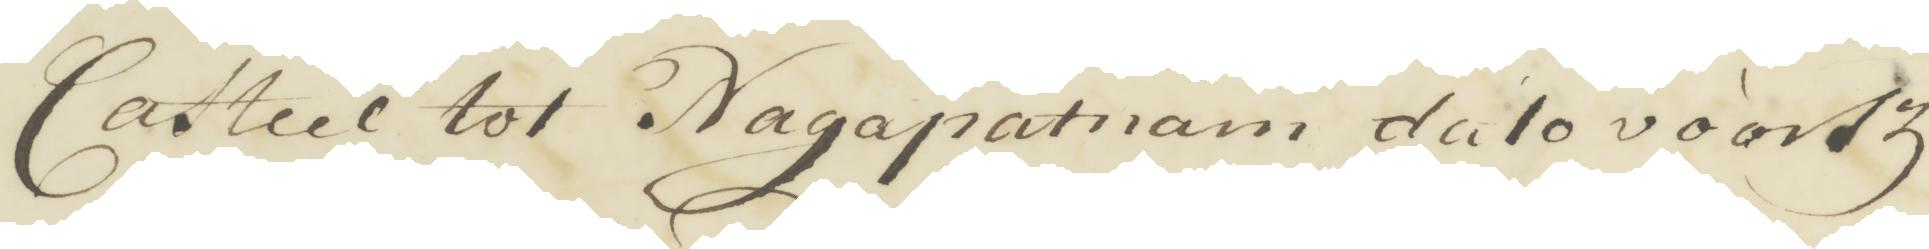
Casteel tot Nagapatnam dato voorsz
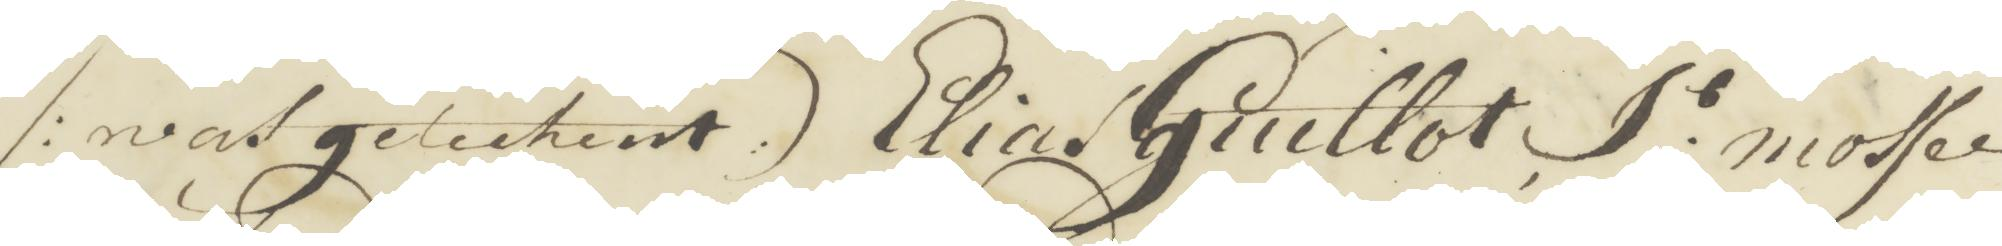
/: was geteekent :) Elias Guillot, I:b mossel
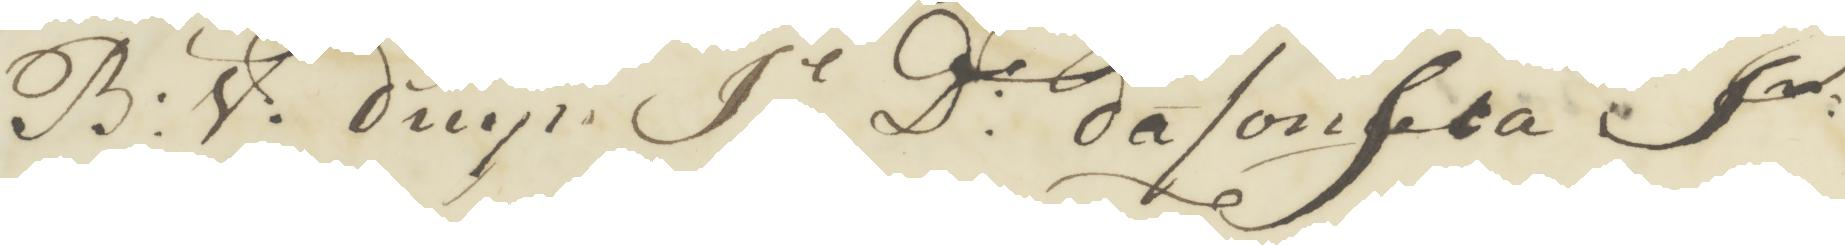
B: V: duijn I:l D:r dasonseca I:n
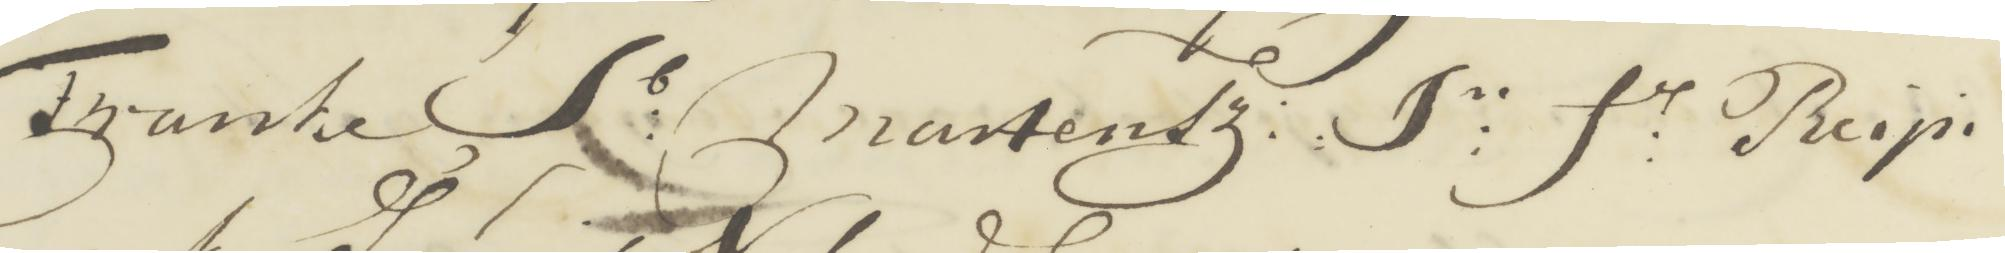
Franke I:b martensz:. I:n f:s Reijn
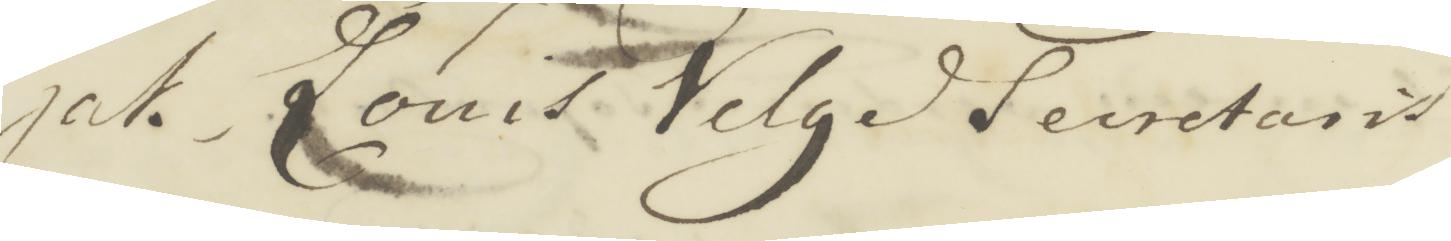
jak, Louis Velge secretaris
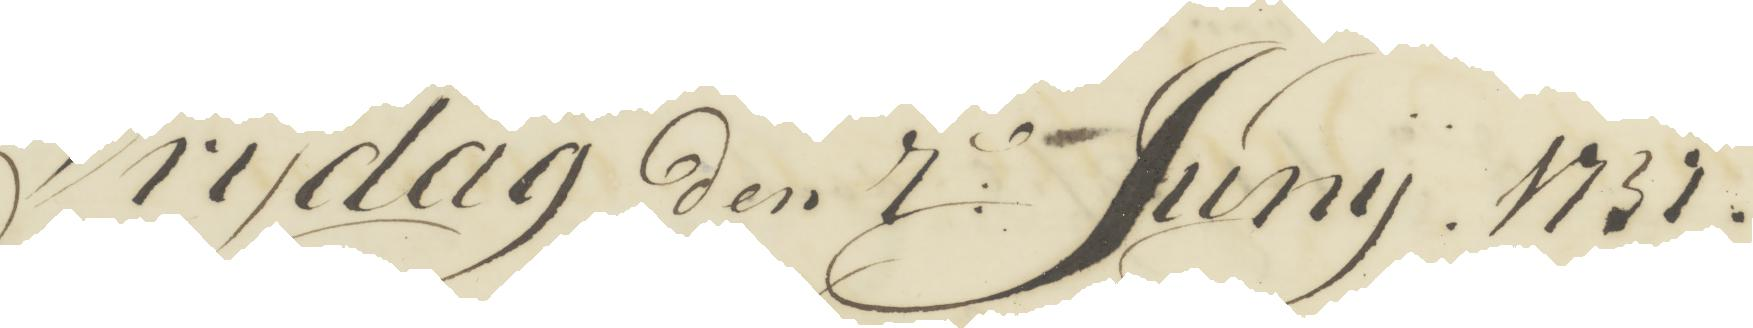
Vrydag den 7:' Junij. 1737.
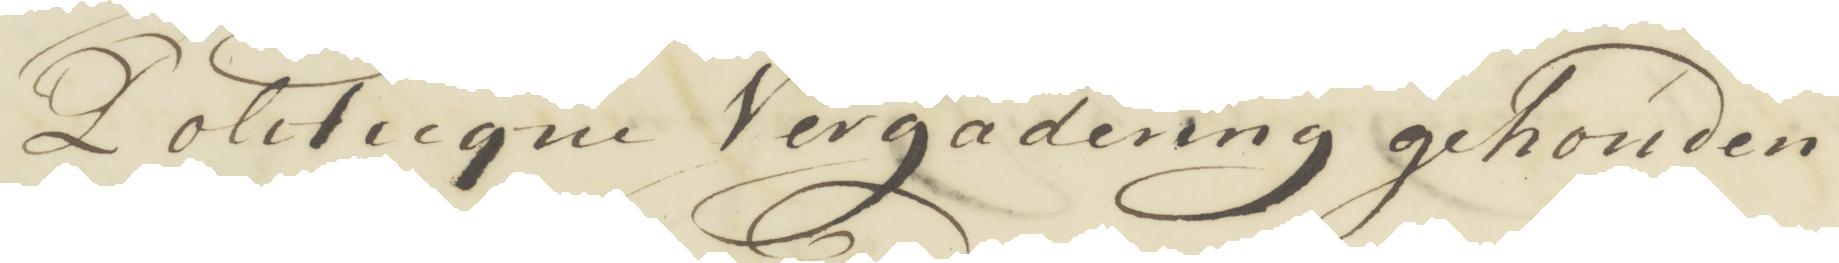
Politicque Vergadering gehouden
